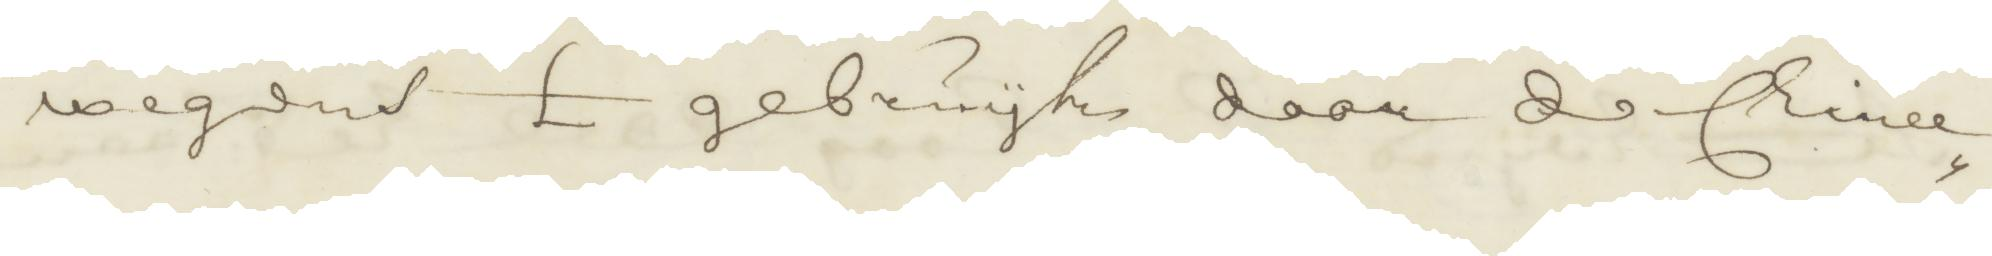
wegens 't gebruijk door de Chinee„
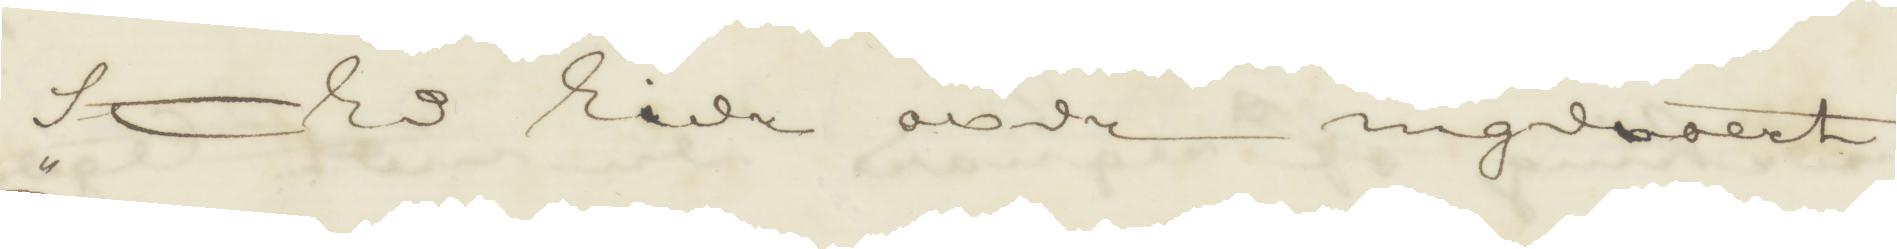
„sche hier over ingevoert
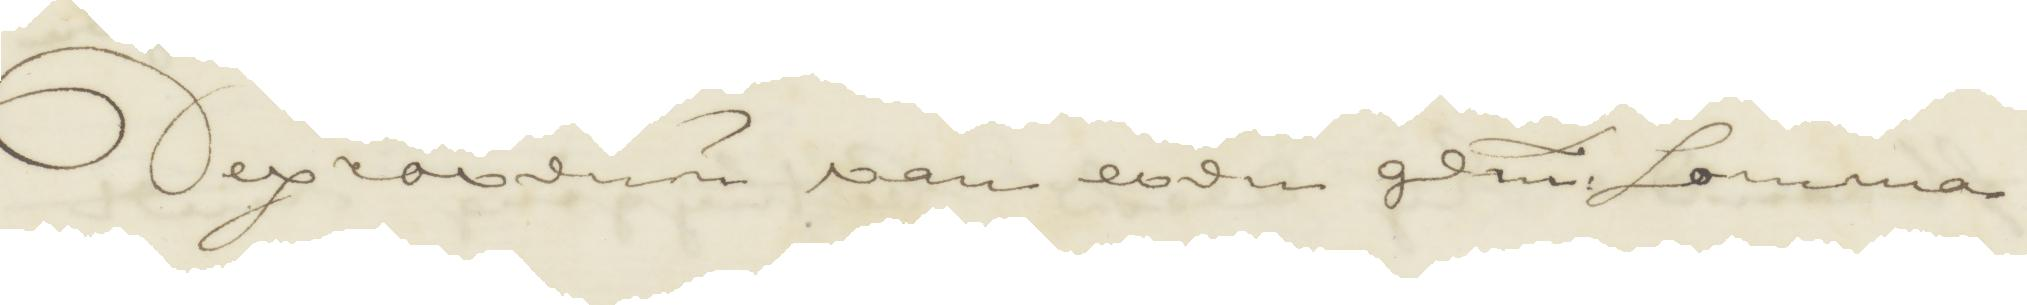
Deprovenu van even gem: somma
